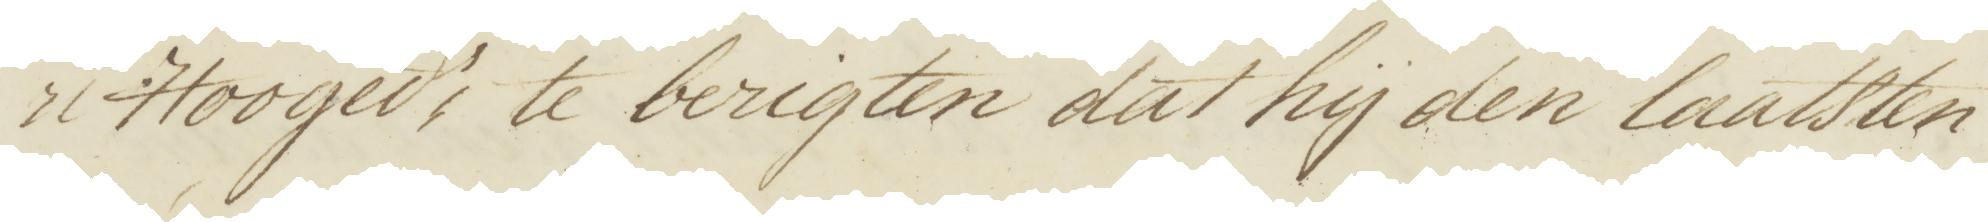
u Hooged„s te berigten dat hij den laatsten
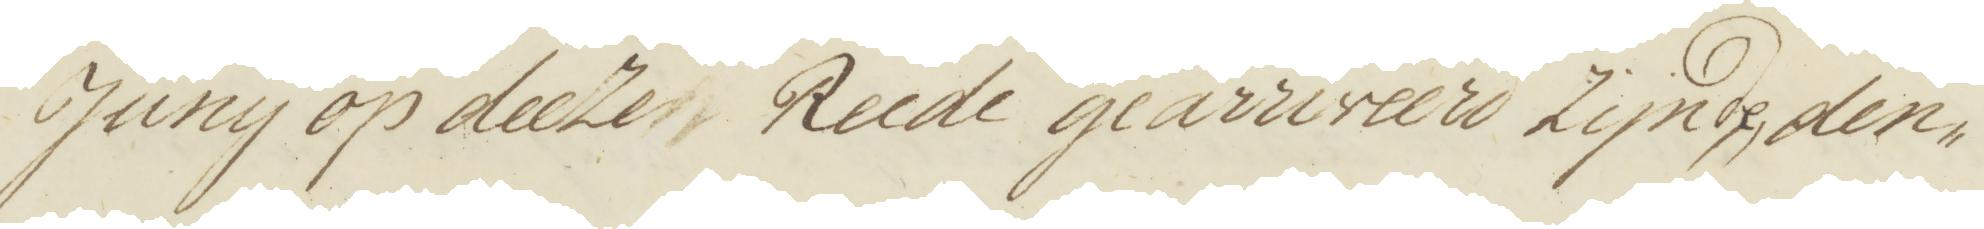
Junij op deeze Reede gearriveerd zijnde, den„
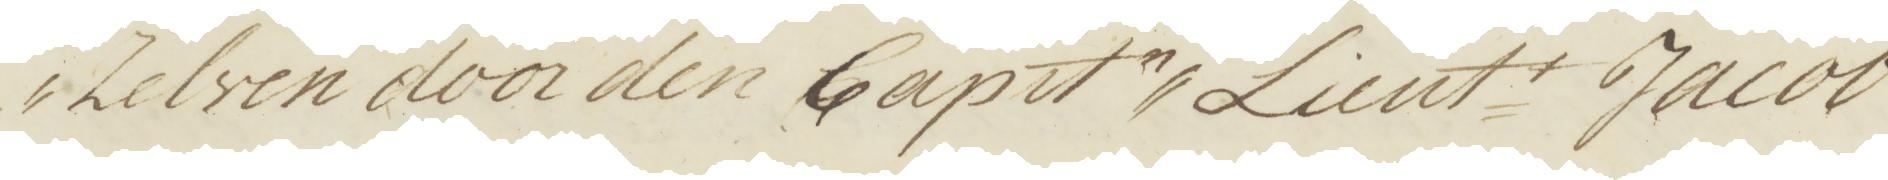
„zelven door den Capit„n Lieut=t Jacob
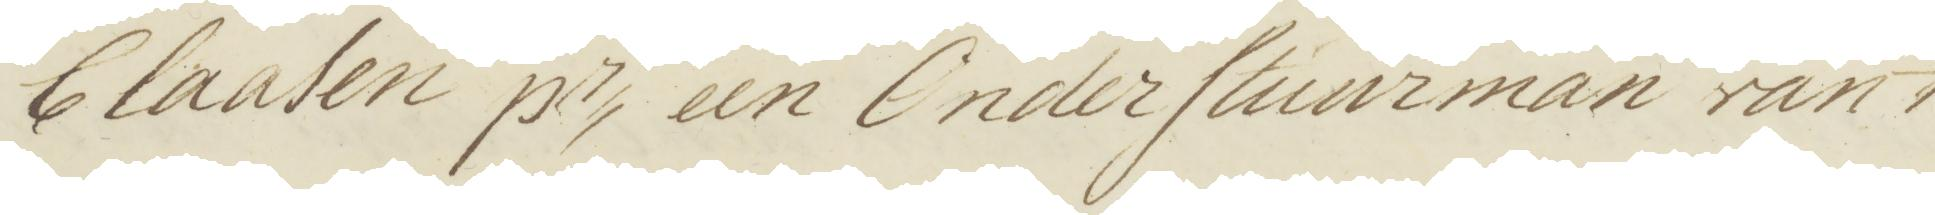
Claasen p„r een Onderstuurman van 't
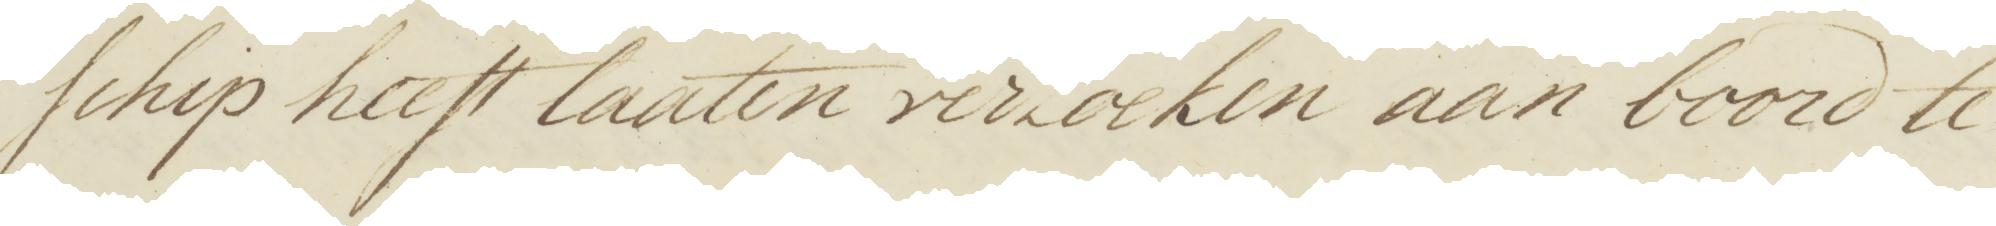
schip heeft laaten verzoeken aan boord te
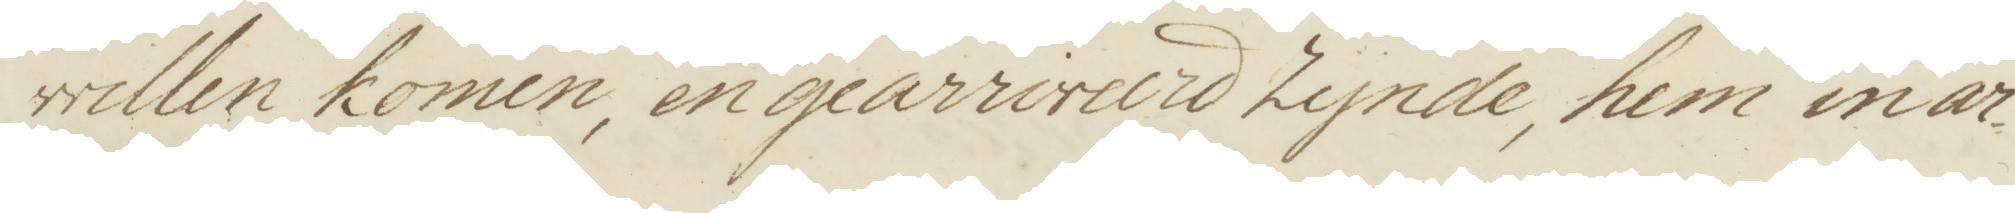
willen komen, en gearriveerd zijnde, hem in ar„
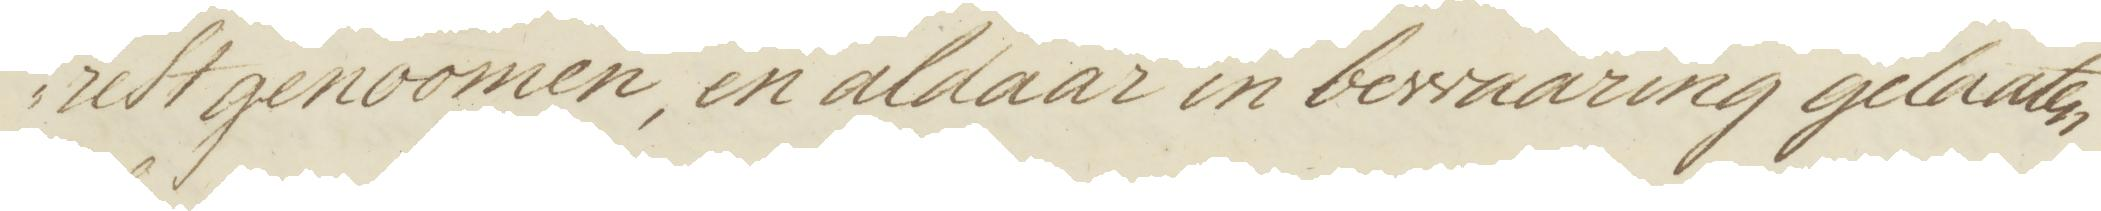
„rest genoomen, en aldaar in bewaaring gelaaten
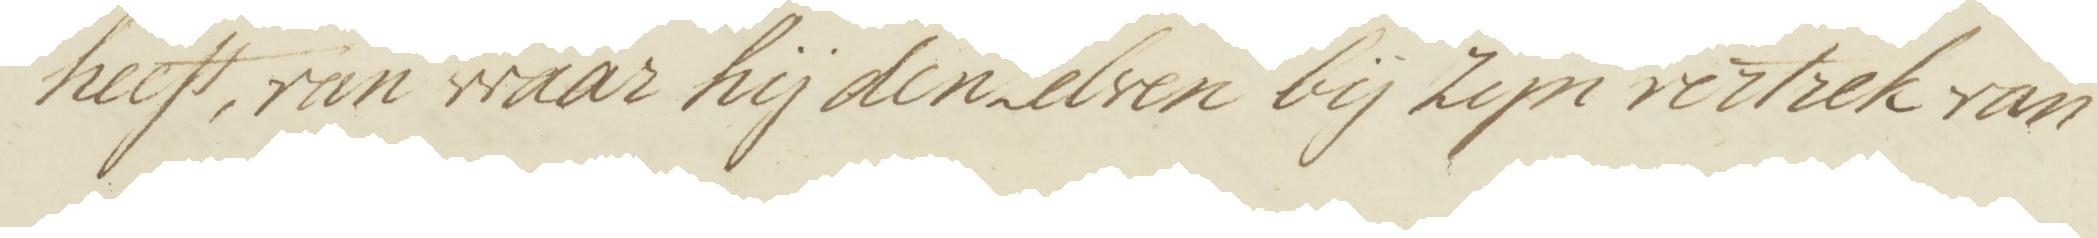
heeft, van waar hij denzelven bij zijn vertrek van
